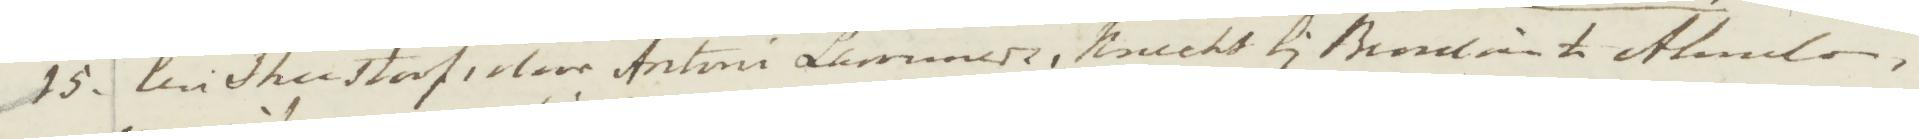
15. Een Theestoof, door Antoni Lammers, Knecht bij Bordien te Almelo,
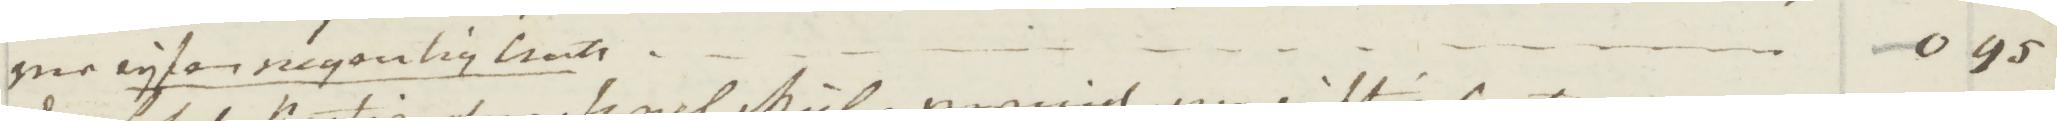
voor vijfen negentig Cents - - - - - - - - - - - - - - - - - - - - - - - - - - - - — 0 95
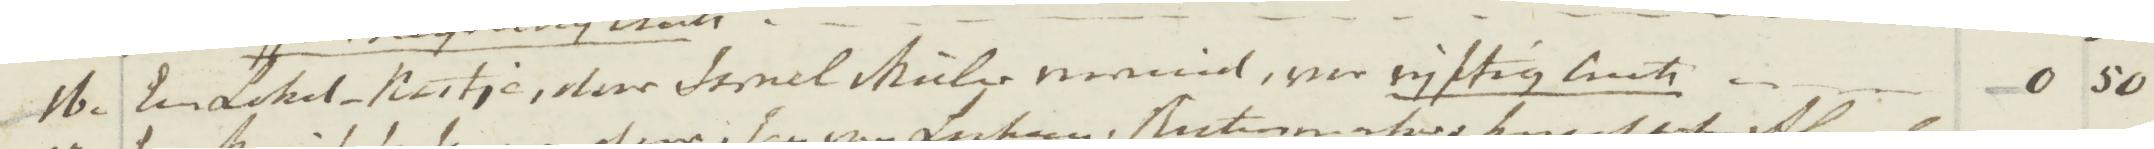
16. Een Loket- Kastje, door Israel Muler voorzeid, vier vijftig Cents- - - - — 0 50
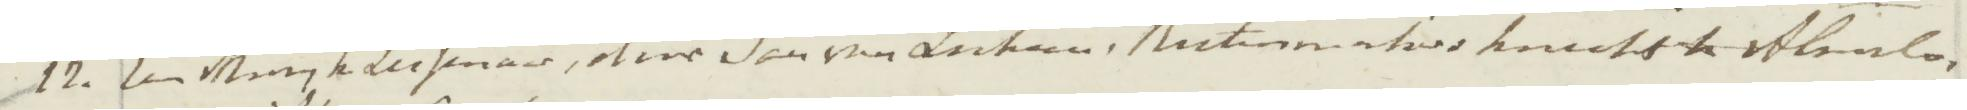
17. Een Muzijk Lessenaar, door Jan van Lestien, Kistenmakers knecht te Almelo„
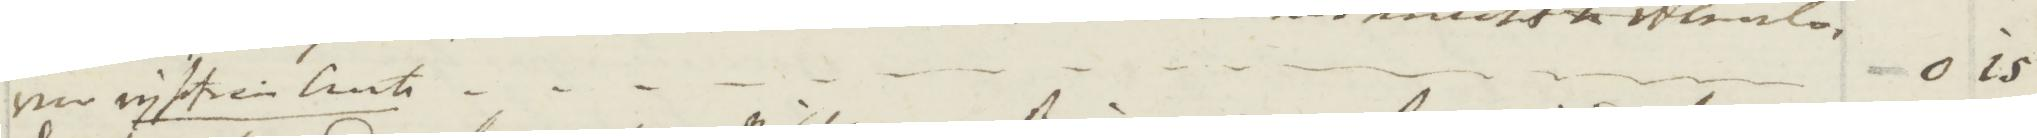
vier vijftien Cents - - - - - - - - - - - - - - - - - - — 0 15
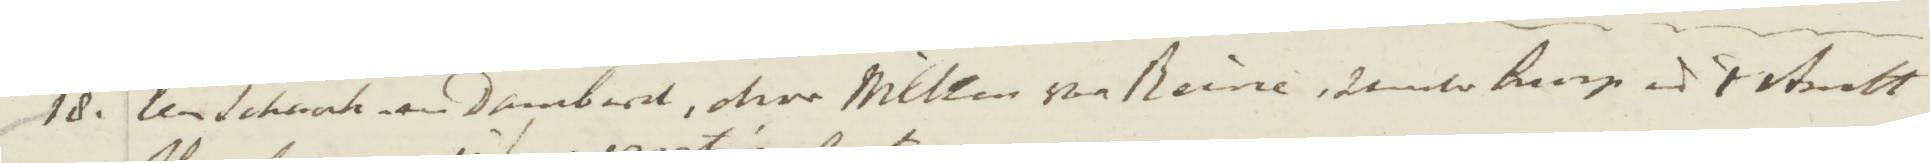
18. Een Schaak een Dambord, door Melten van Reine, zonder beroep in 't Ambt
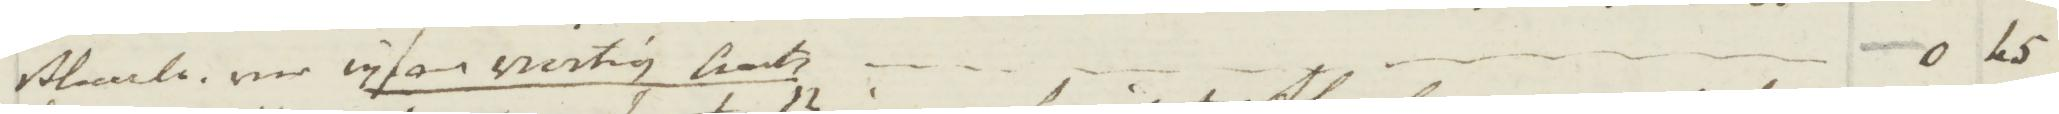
Almelo, voor vijf en veertig Cents - - - - - - - - - - - - - - - - - - - - - - - — 0 45
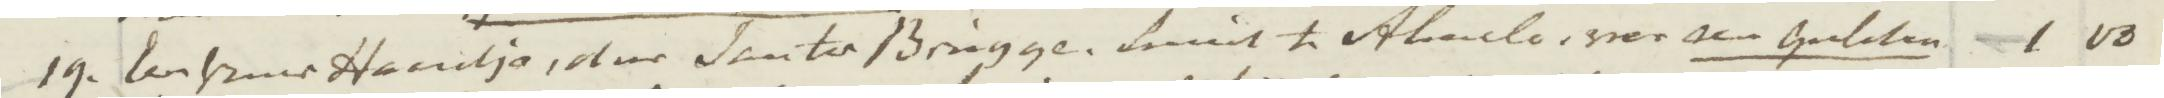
19. Een Vuur Haardje, der Jan ter Brugge, Smit te Almelo, voor een Gulden —1 00
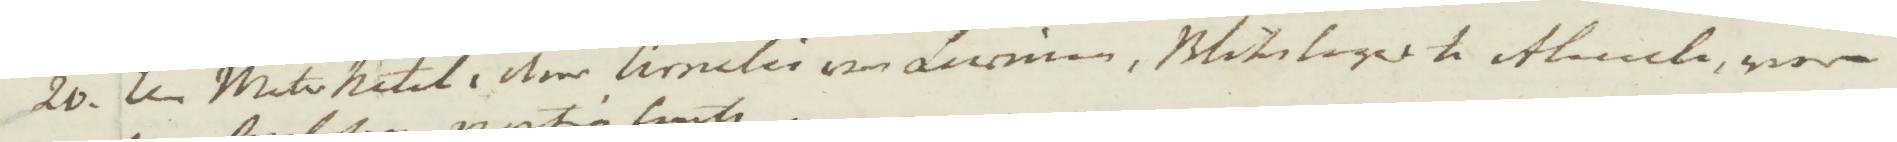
20. Een Meter ketel, door Cornelis van Luman, Blikslager te Almelo, voor
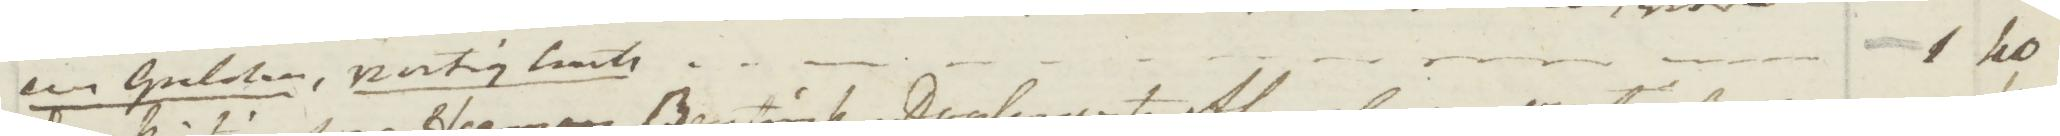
een Gulden, veertig Cents - - - - - - - - - - - - - - - - - - - - - - - - - - - - - - - — 1 40
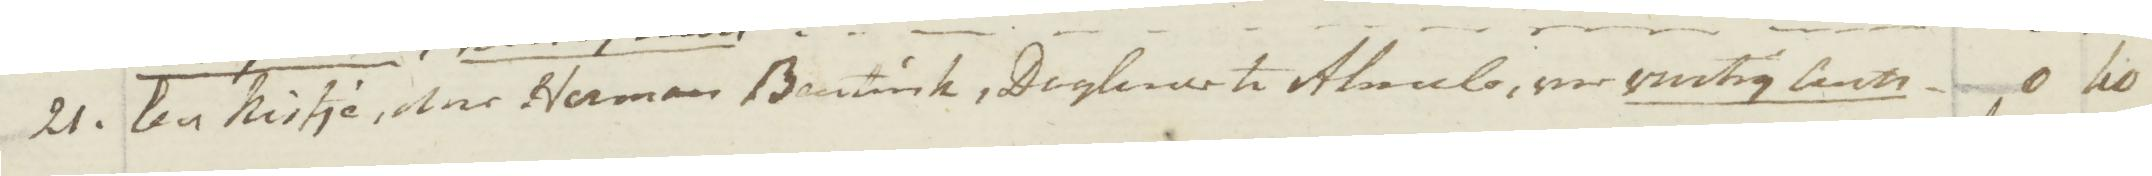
21. Een kistje, door Herman Beertink, Dagloner te Almelo, van veertig Cents- —0 40
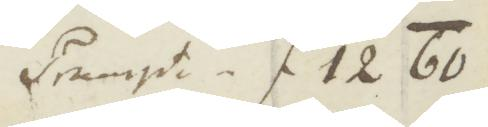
Transpt: - ƒ 12 60
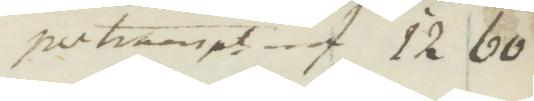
per transpt - - ƒ 12 60
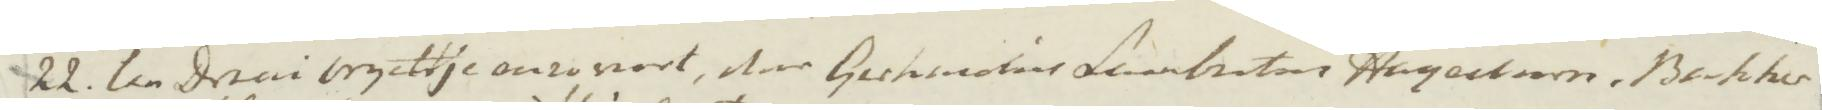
22. Een Draaiorgeltje enzo voort, door Gerhardus Lambertus Hagedoorn, Bakker
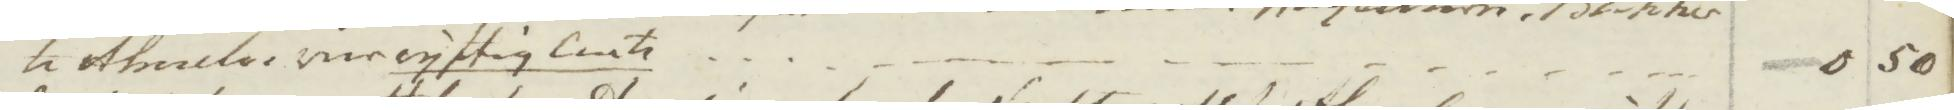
te Almelo voor vijftig Cents - - - - - - - - - - - - - - - - - - - - - - - - - - - - - - 5 50
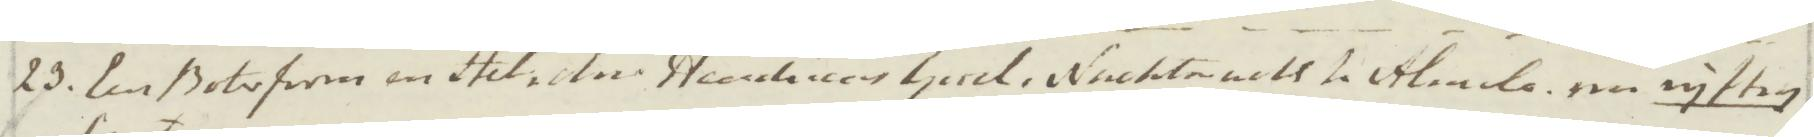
23. Een Boterform en stel, drie Hendricus Gorel, Nachtwacht te Almelo, nu vijftig
